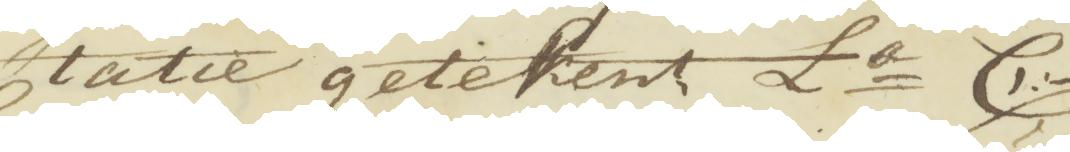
tatie geteken:t L=a C:
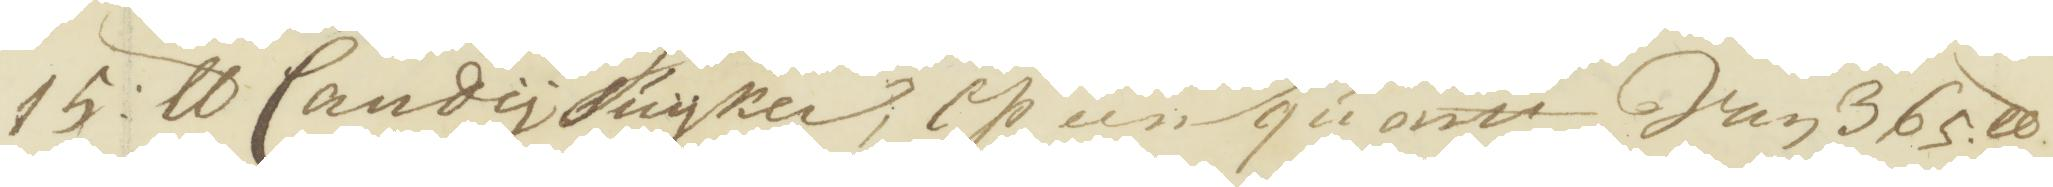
15: lb Candij suijker; Op een quant=t van 365. lb
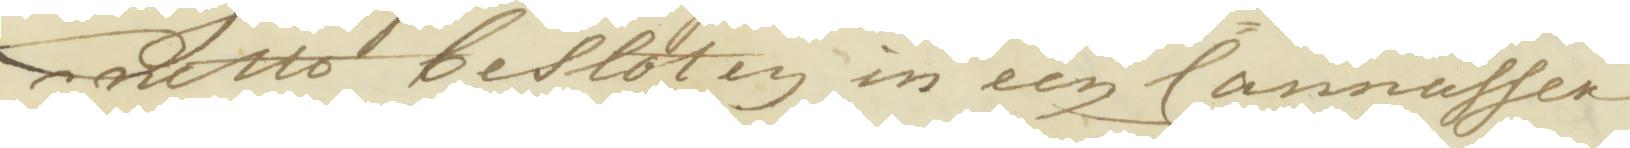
netto besloten in een Cannasser
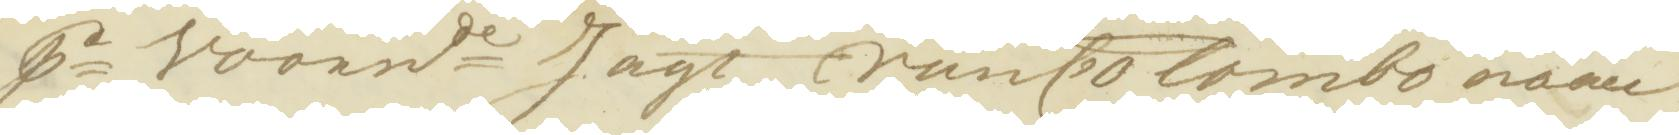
p=r voorn=de Jagt van Colombo naar
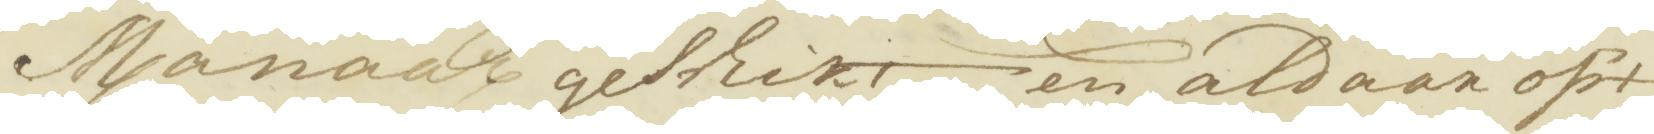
Manaar geschikt en aldaar op't
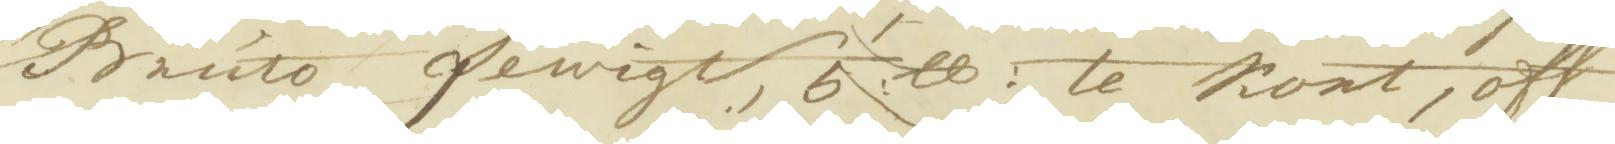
Bruto gewigt, 1/5: lb: te kort, off
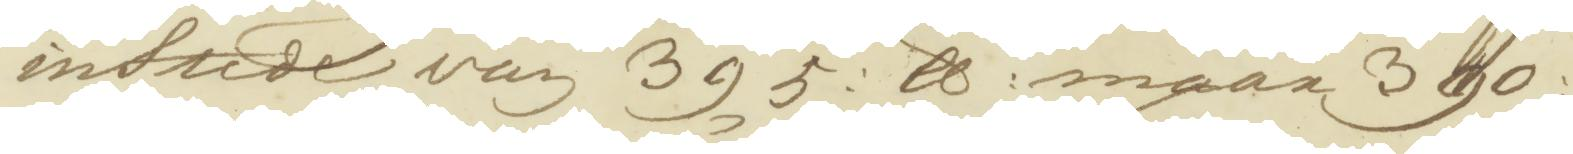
instede van 395: lb: maar 390:
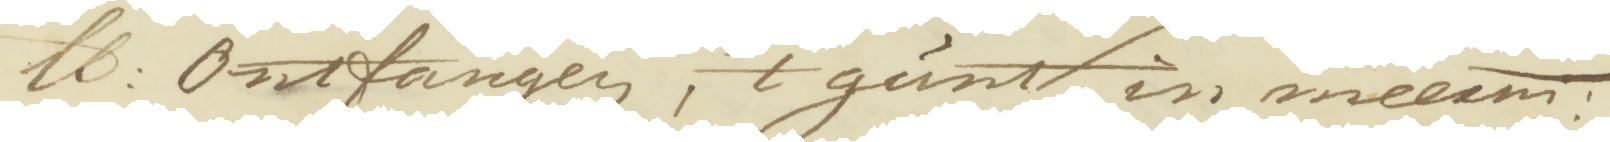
lb: Ontfangen, ’t gunt in meerm:
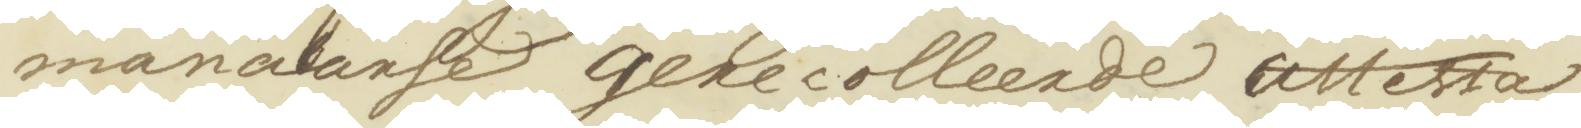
manaarse gerecolleerde attesta
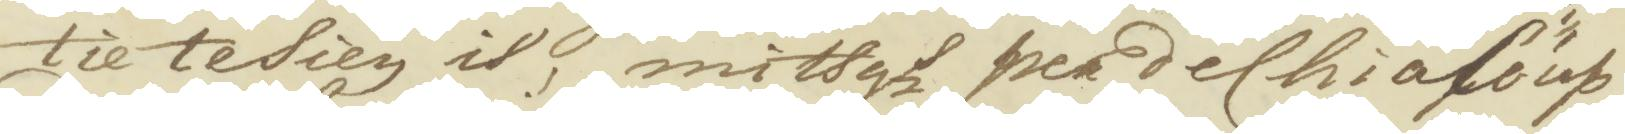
tie tesien is; mitsg=s per de Chialoup
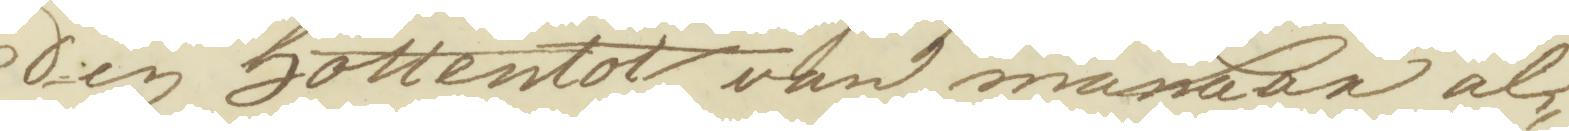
den hottentot van manaar al„
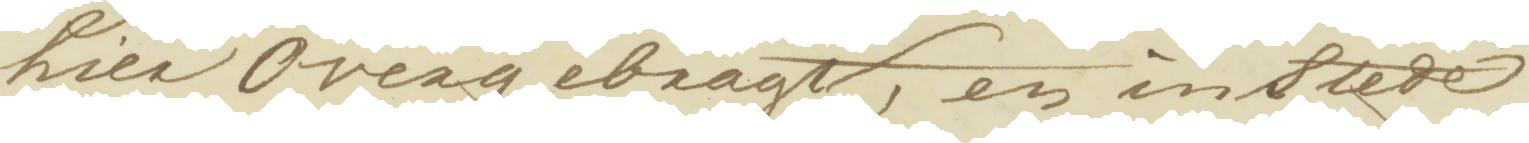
hier overgebragt, en instede
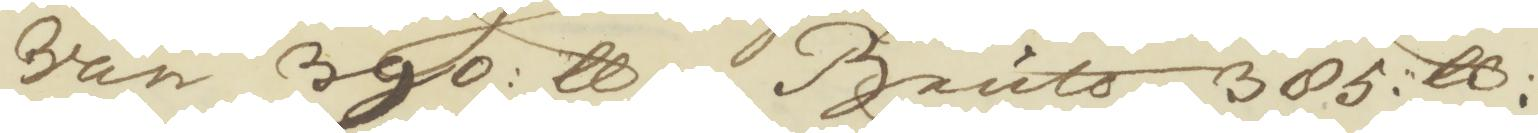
van 390: lb: Bruto, 385: lb:
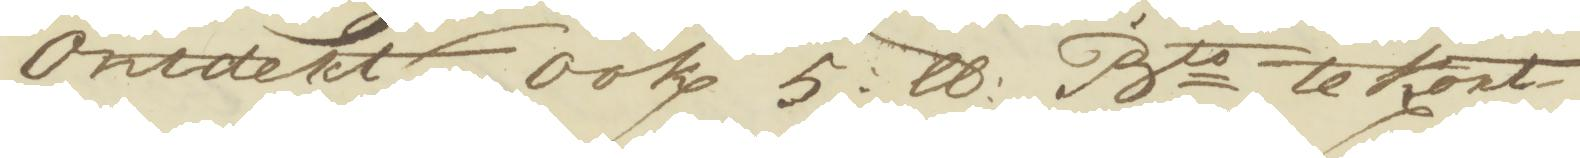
ontdekt, ook 5: lb: B=to te kort
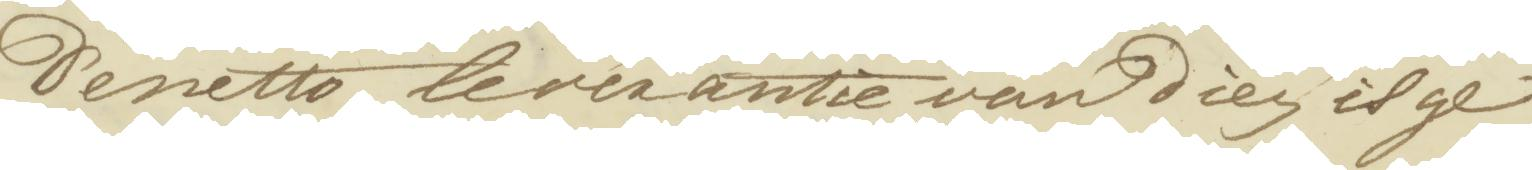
de netto leverantie van dien is ge
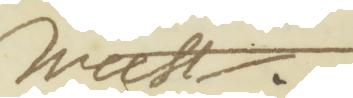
weest.
